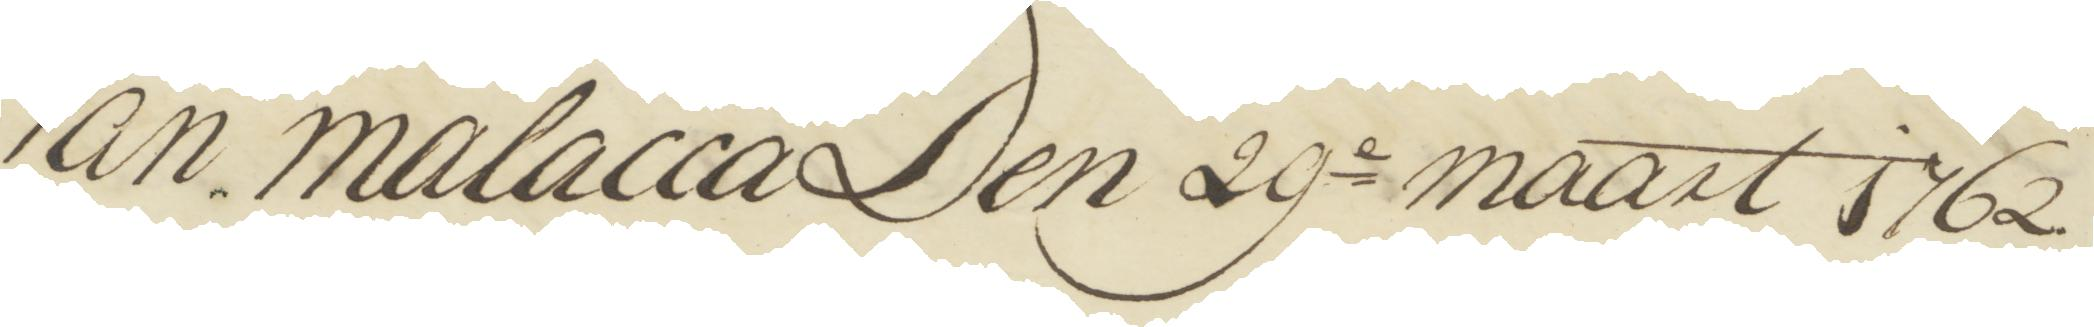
Van Malacca Den 29=e maart 1762.
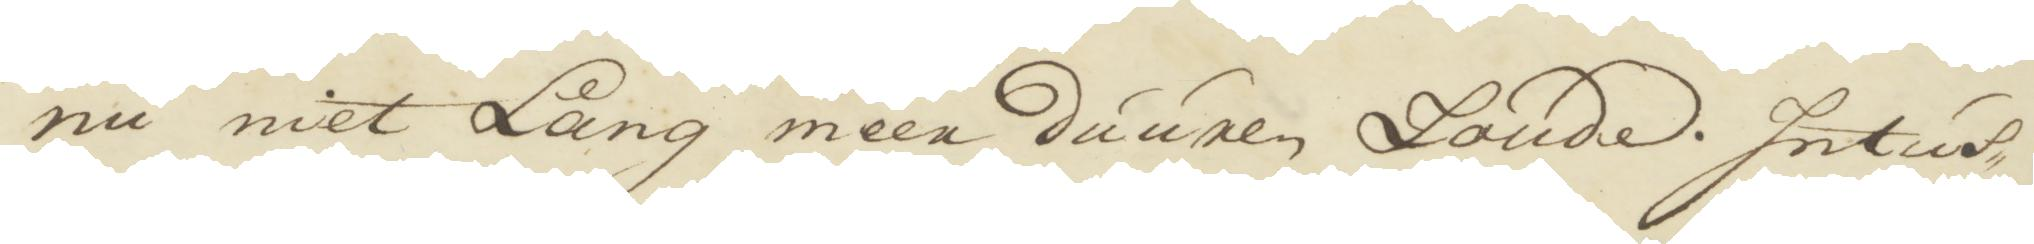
nu niet Lang meer duuren zoude. Jntus„
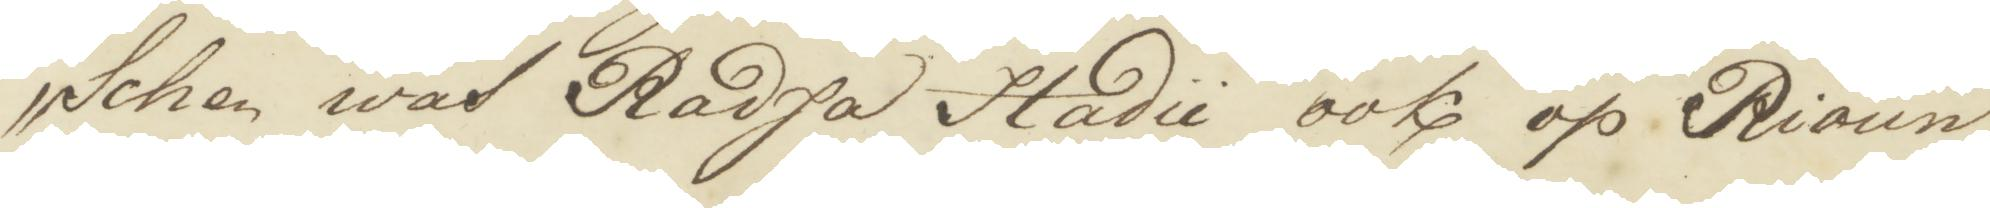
„schen was Radja Hadie ook op Riouw
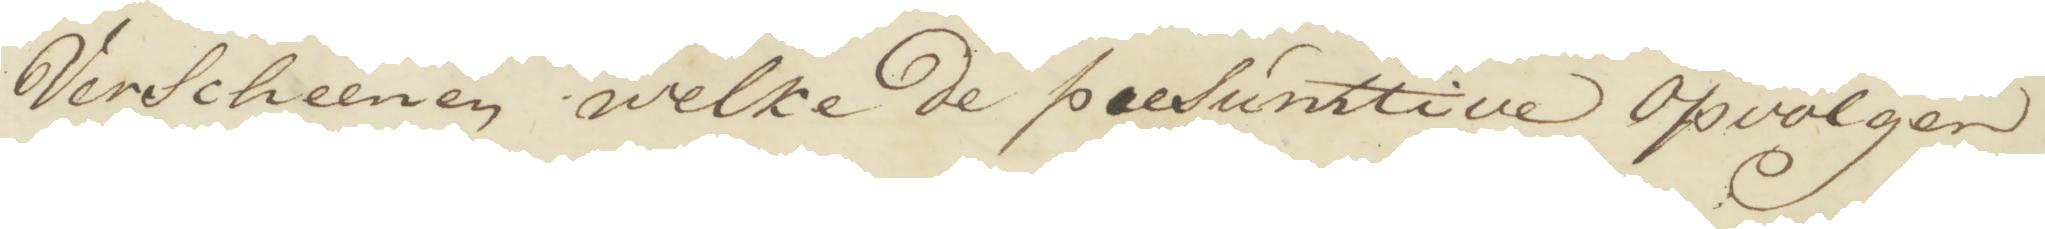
verscheenen welke de presumtive opvolger
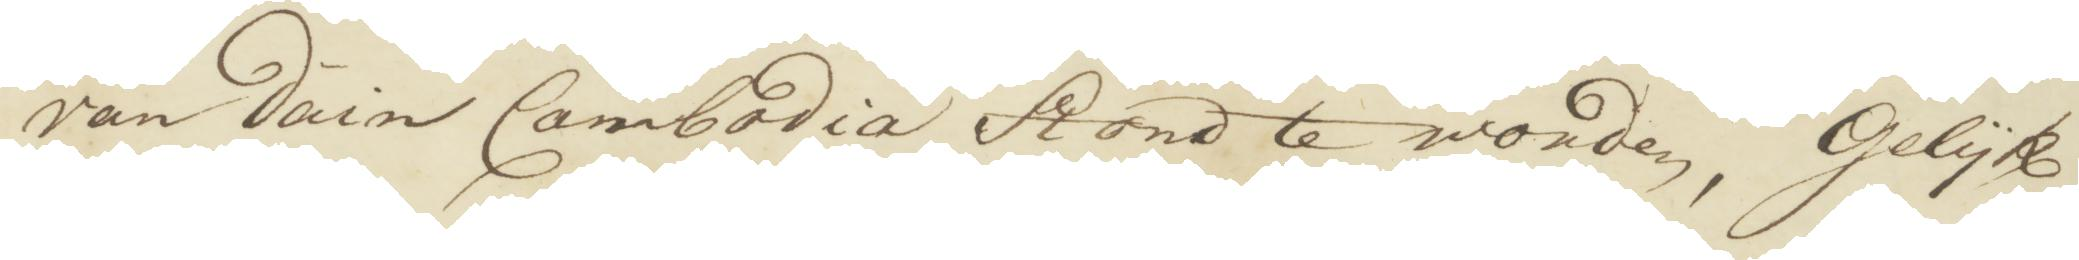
van dain Cambodia stond te worden, Gelijk
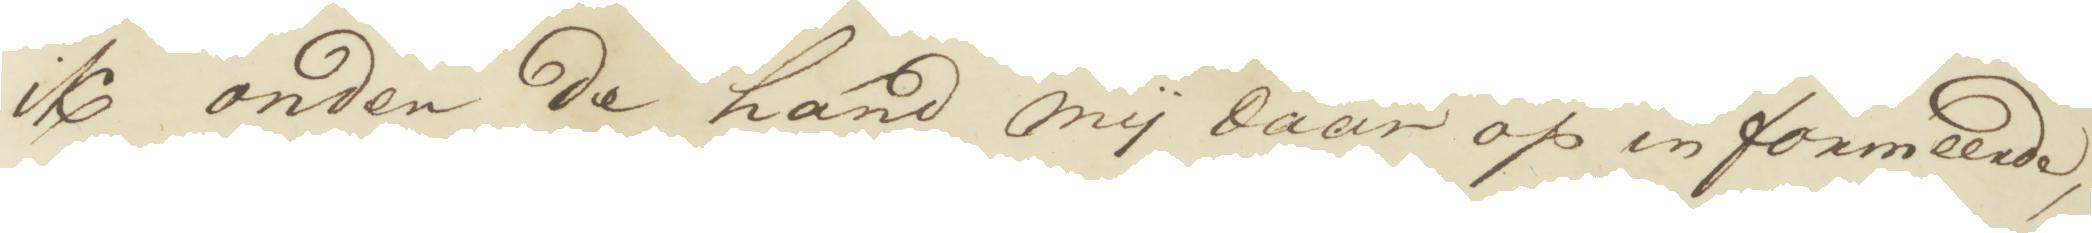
ik onder de hand mij daar op informeerde,
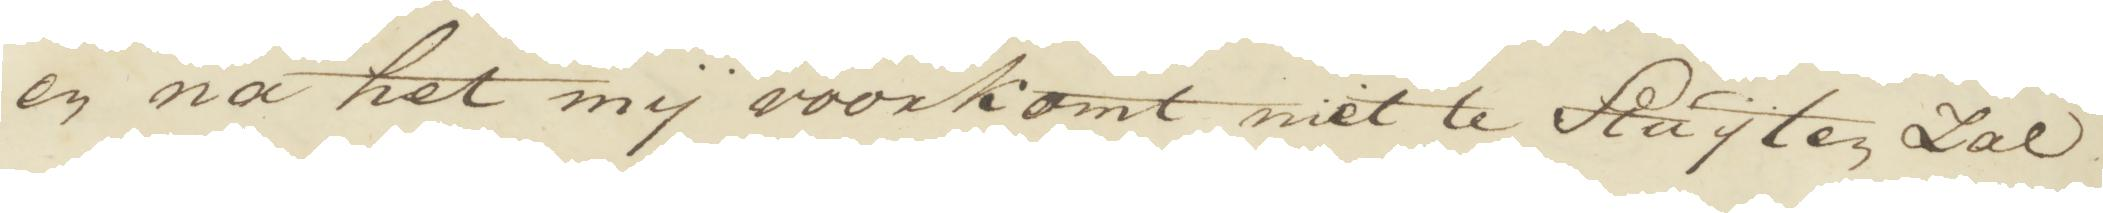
en na het mij voorkomt niet te stuijten zal
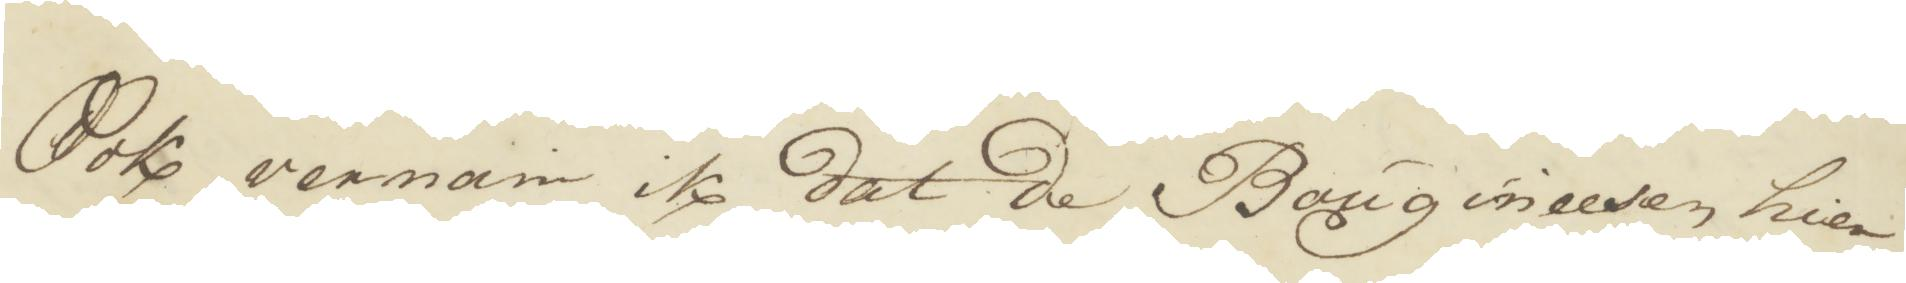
Ook vernam ik dat de Bougineesen hier
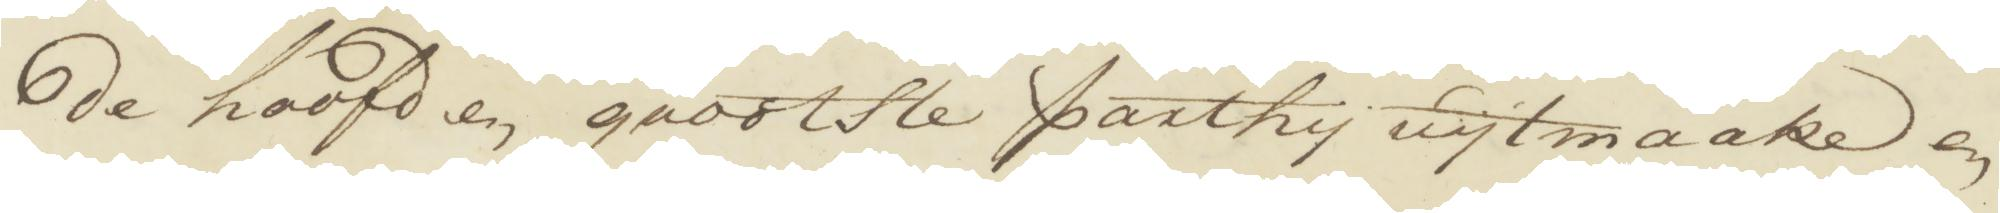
de hoofd en grootste parthij uijtmaake en
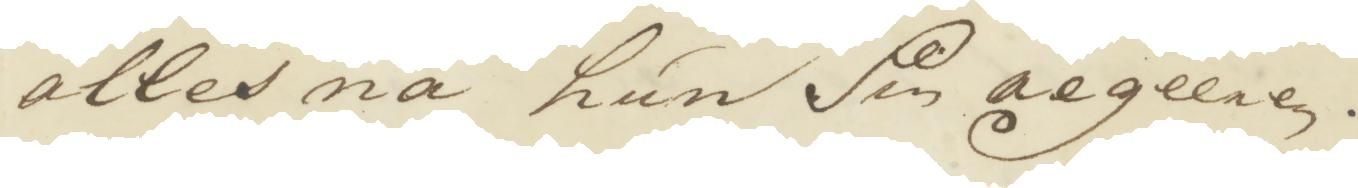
alles na hun sin aegeeren.
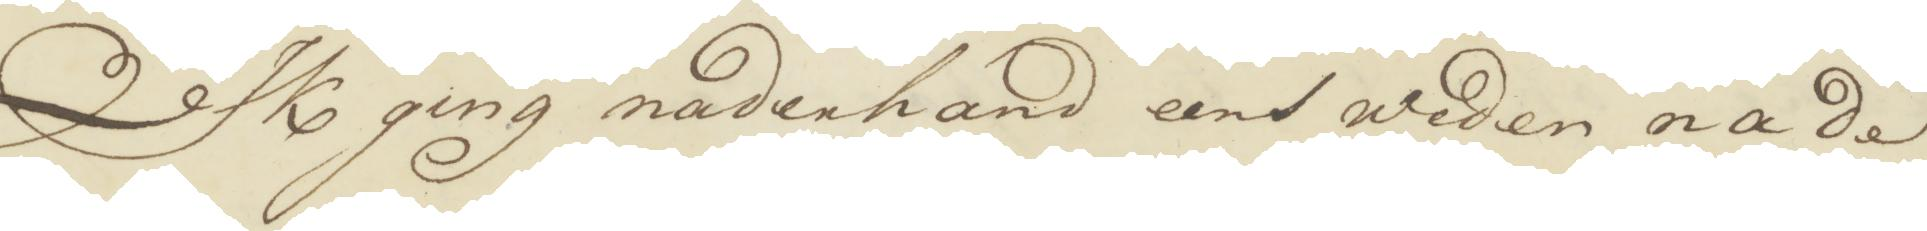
Ik ging naderhand eens weder na de
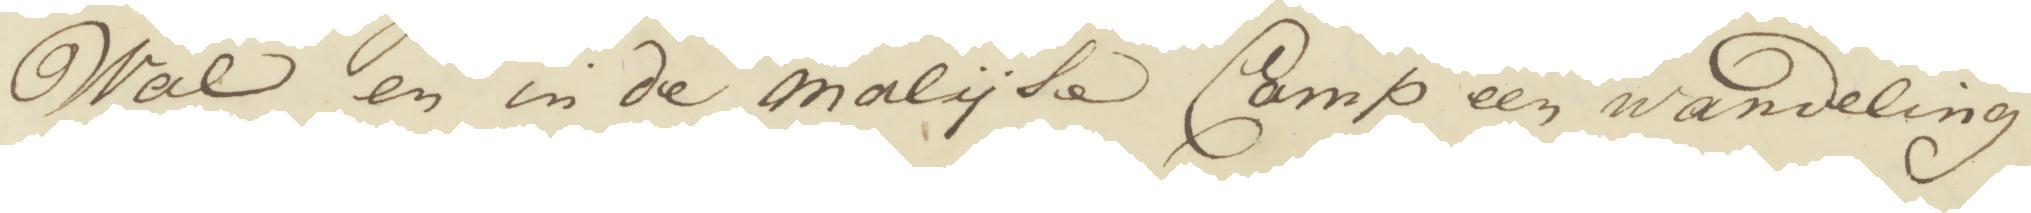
wal en in de malijse Camp een wandeling
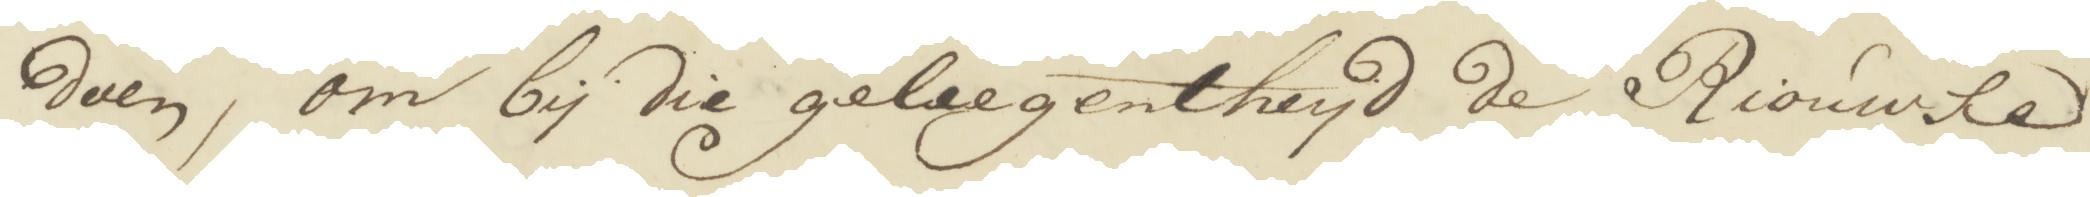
doen, om bij die geleegentheijd de Riouwse
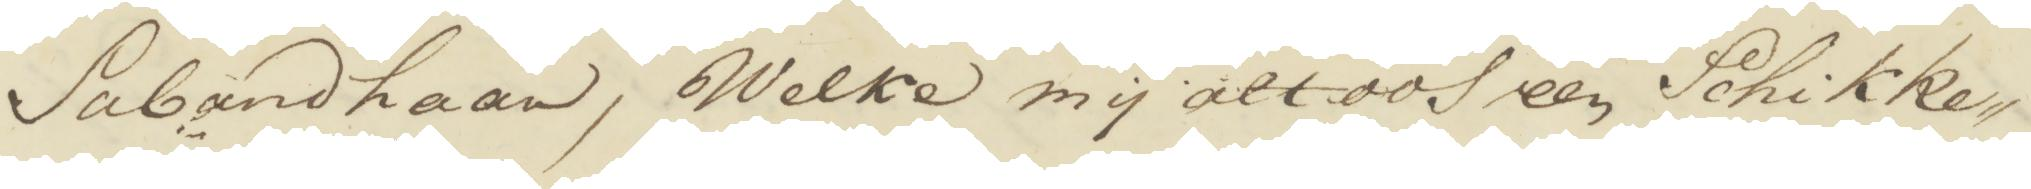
Sabandhaar, welke mij altoos een schikke„
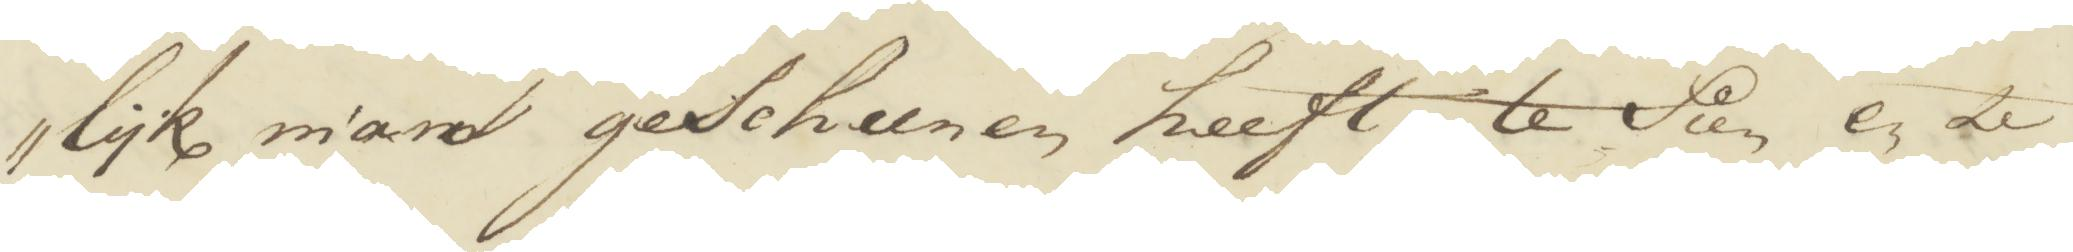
„lijk mans gescheenen heeft, te sien en te
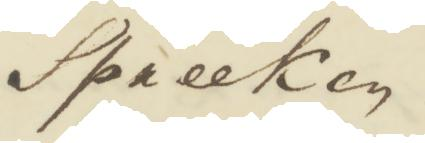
spreeken
